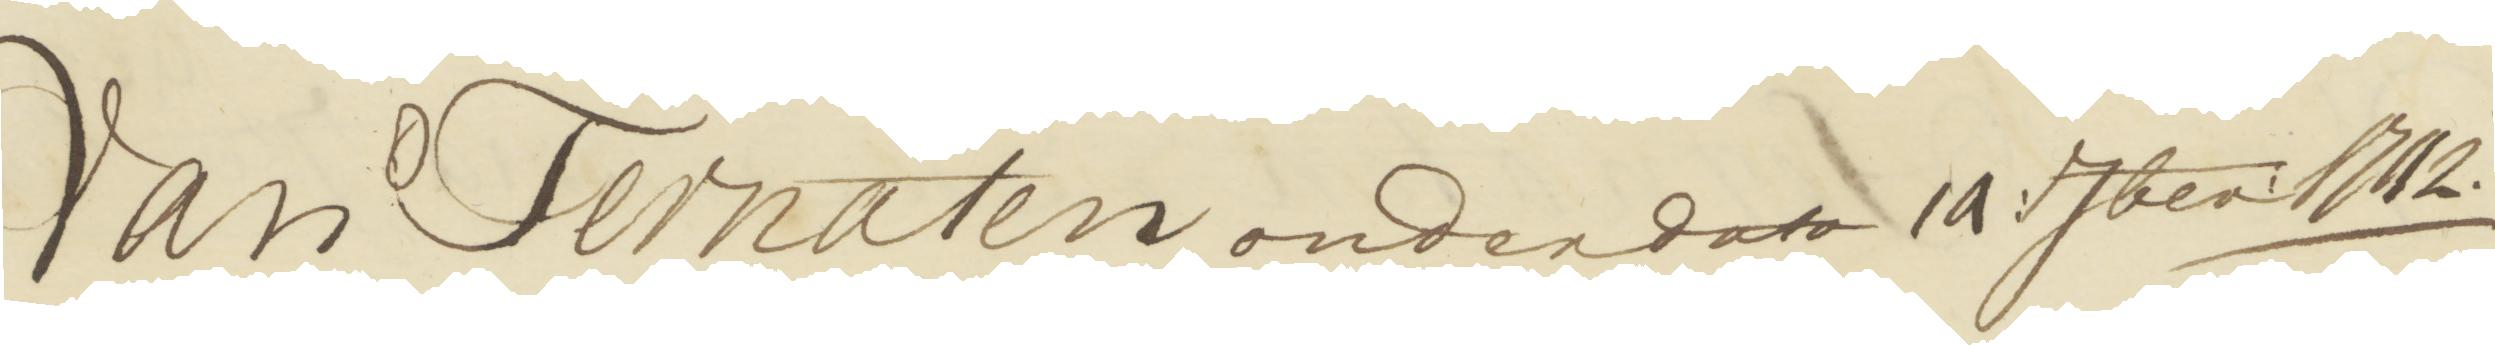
Van Ternaten onder dato 14: 7ber: 1742
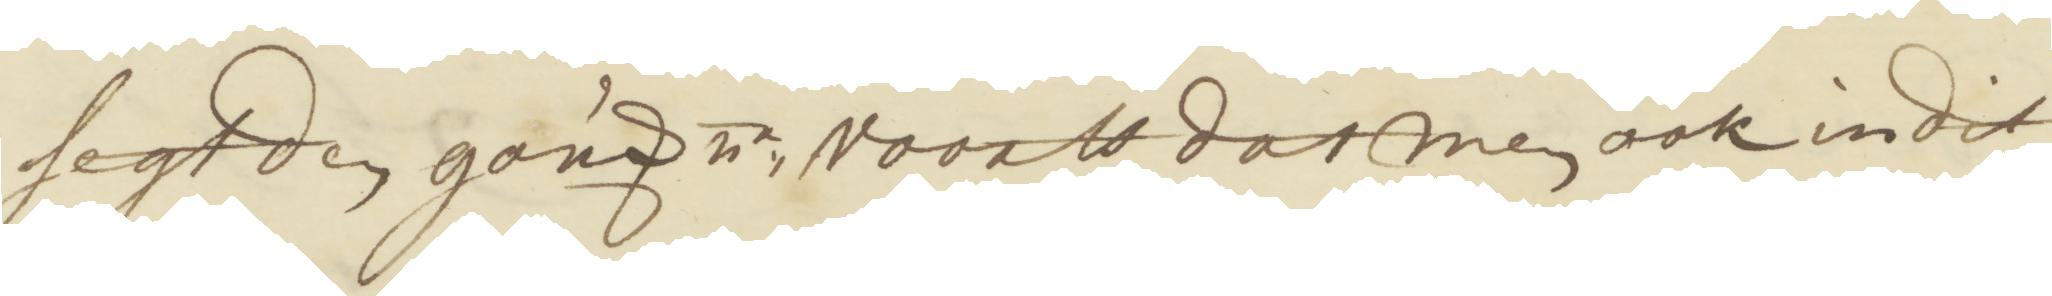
segt den gouvern„r voorts dat men ook in dit
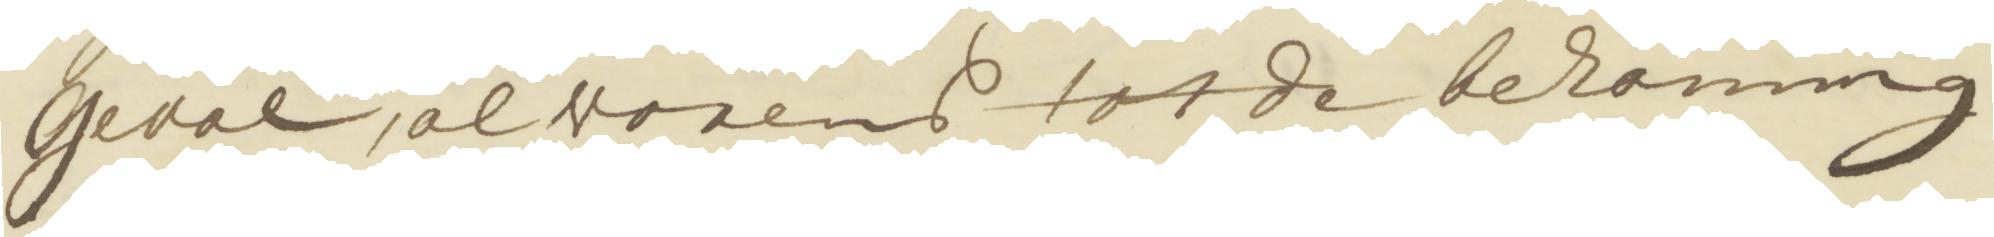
geval, alvorens tot de beraming
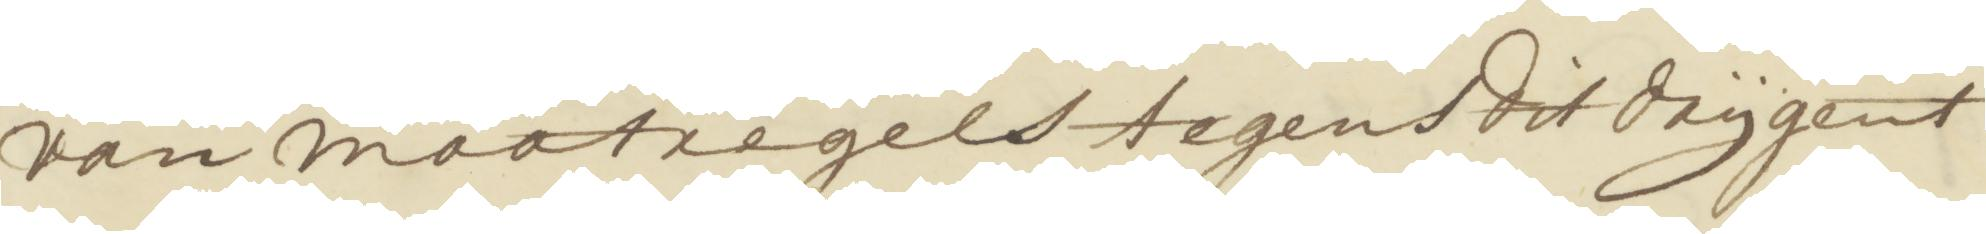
van maatregels tegens dit drijgent
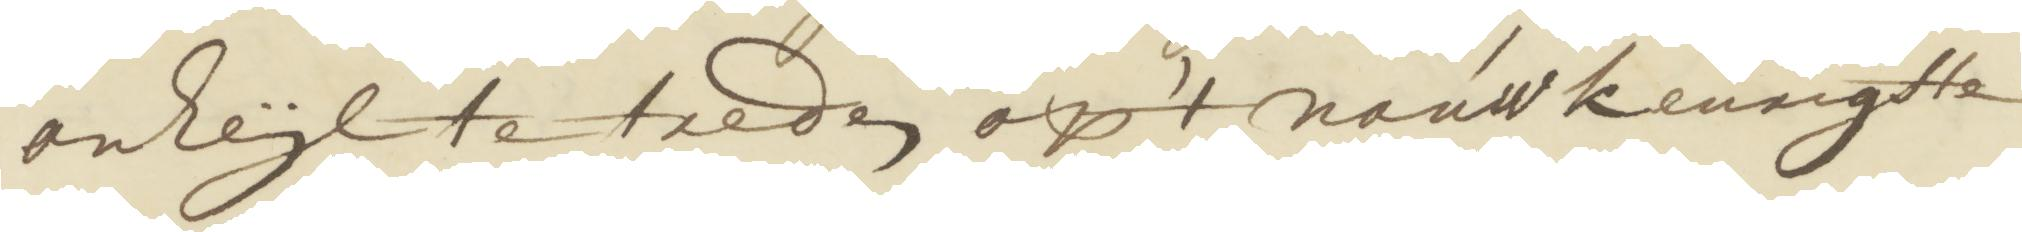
onheijl te treden op ’t nauwkeurigste
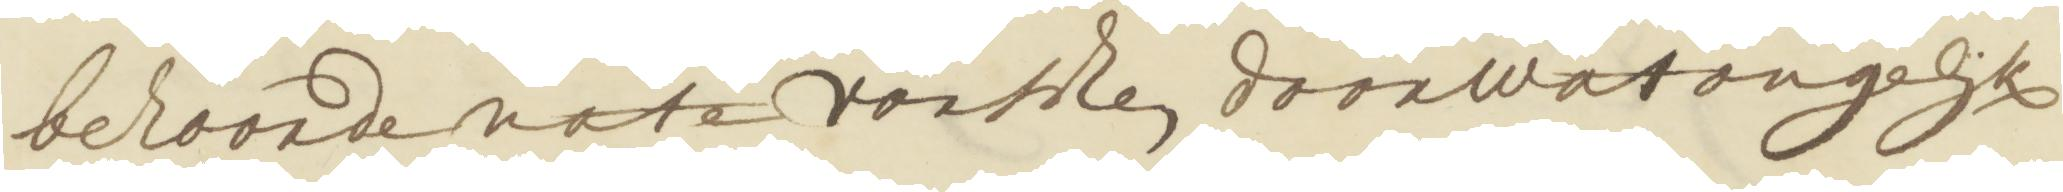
behoorde nate vorschen daar wat ongelijk
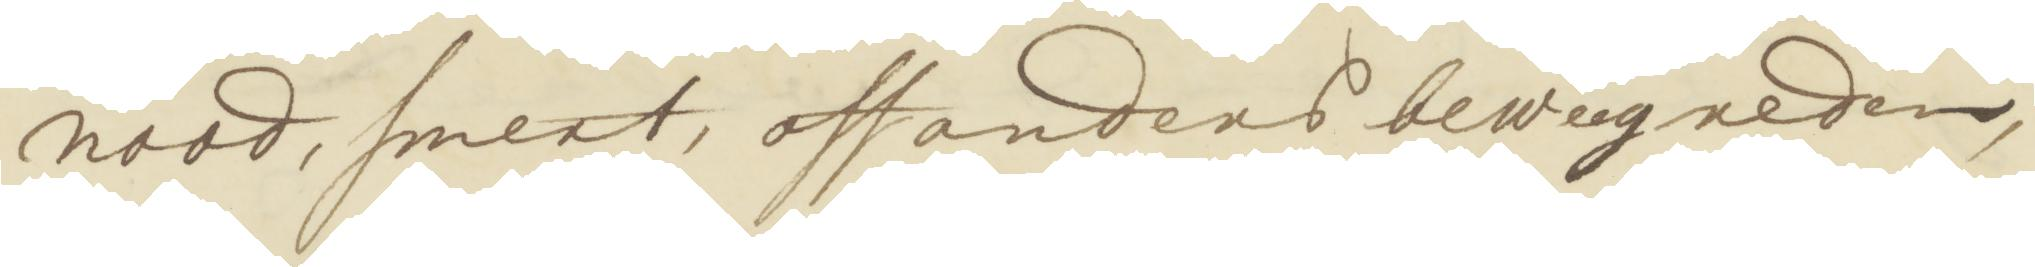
nood, smert, off anders beweegreden,
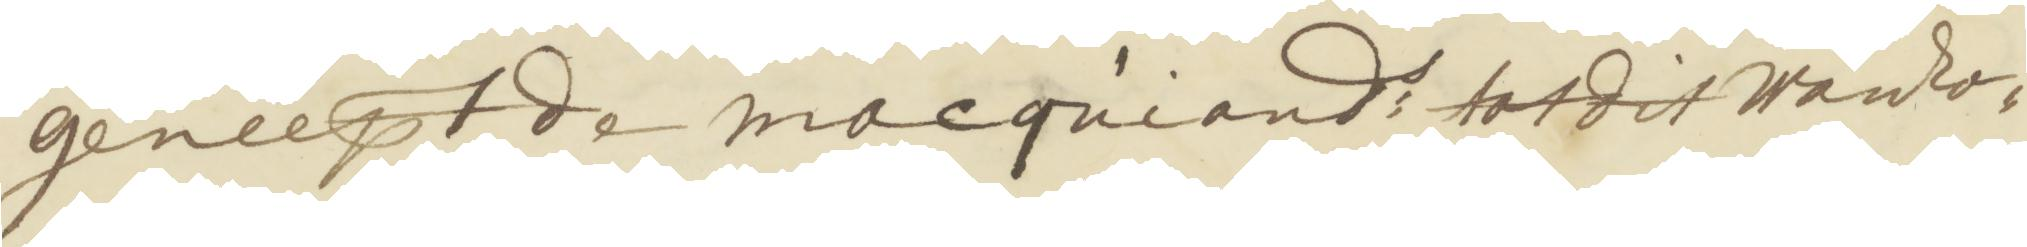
geneept de mocquiand:s tot dit wanho„
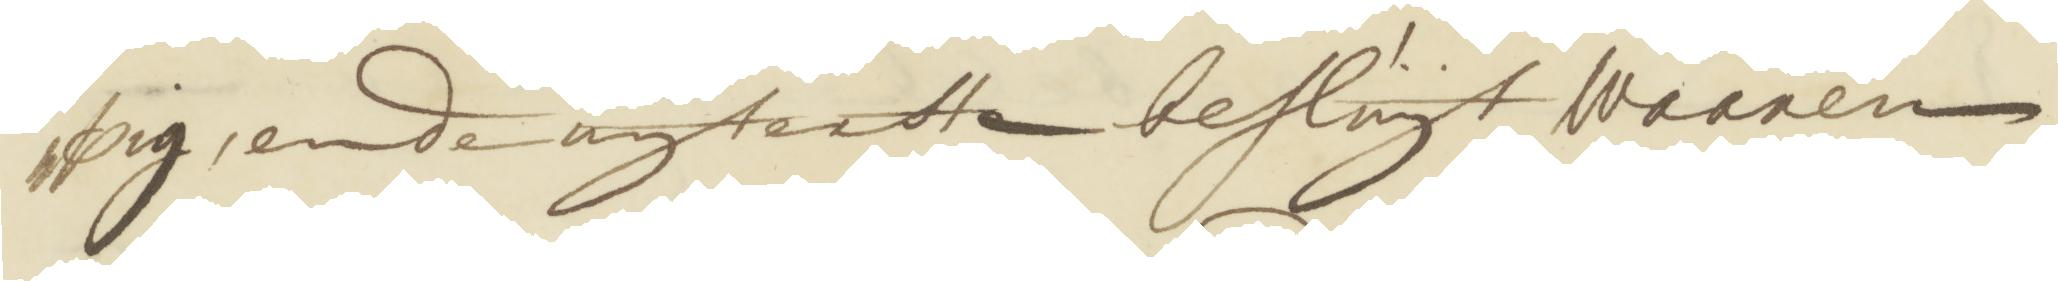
„pig, en de uijterste besluijt waaren
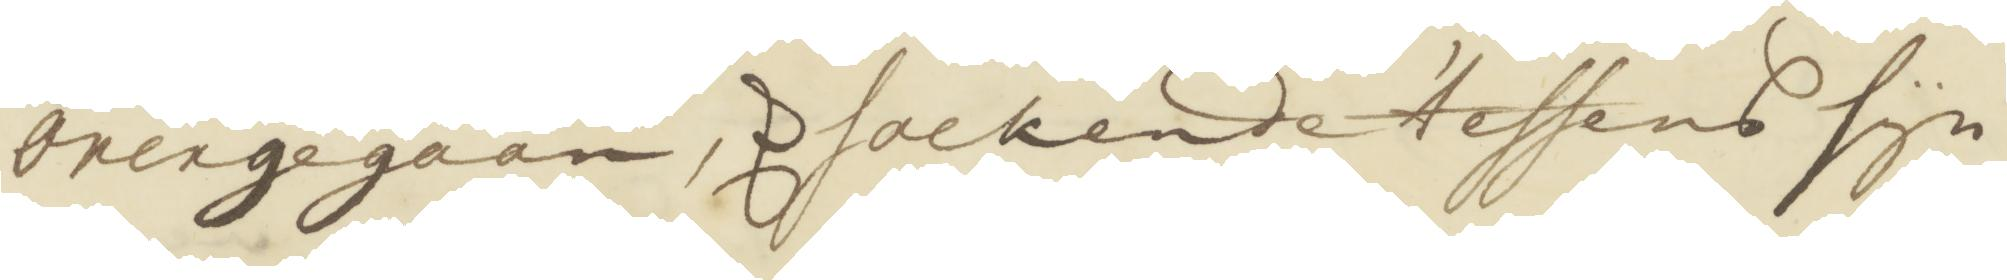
overgegaan, versoekende 'teffens sijn
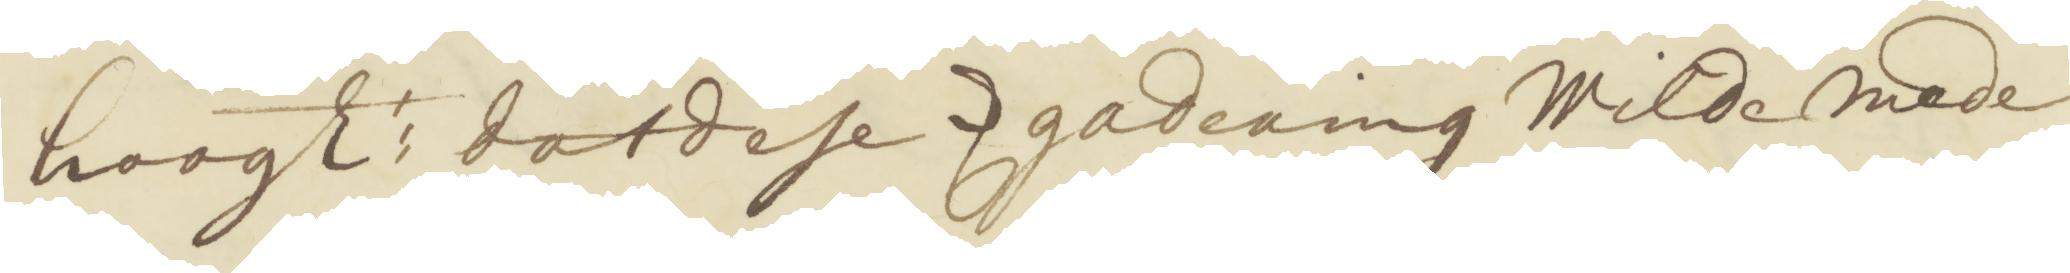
hoogh„t dat dese vergadering wilde mede
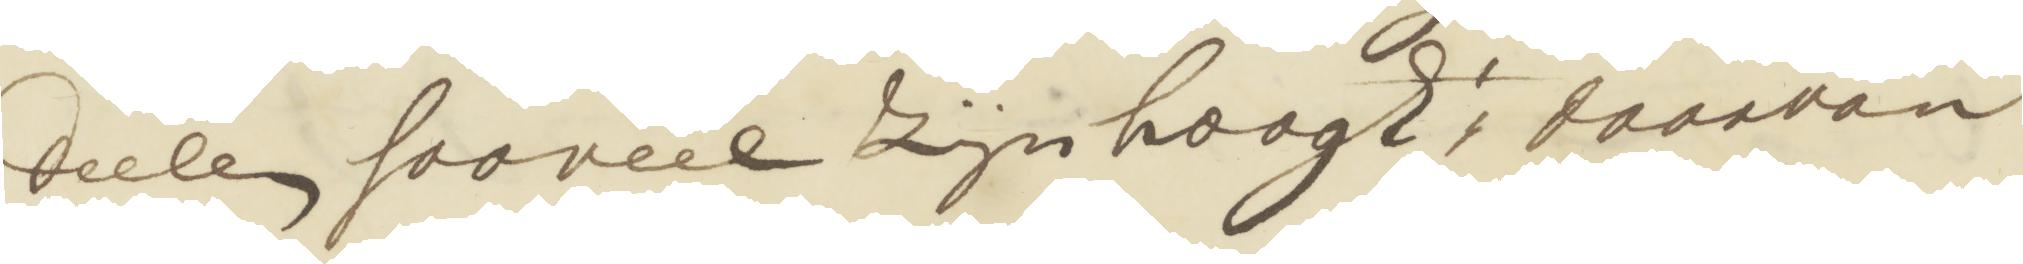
deelen sooveel zijn hoogh„t daarvan
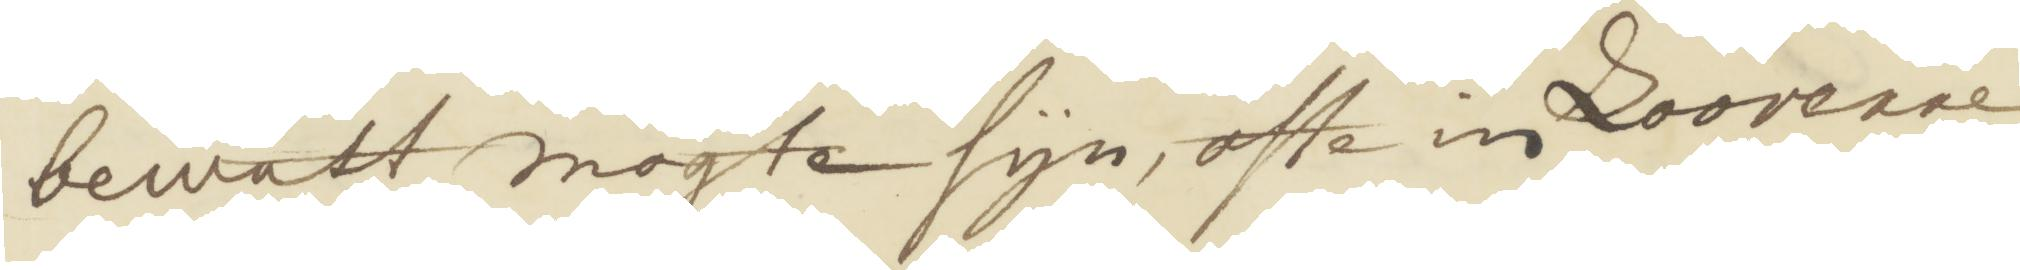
bewust mogte sijn, ofte in zooverre
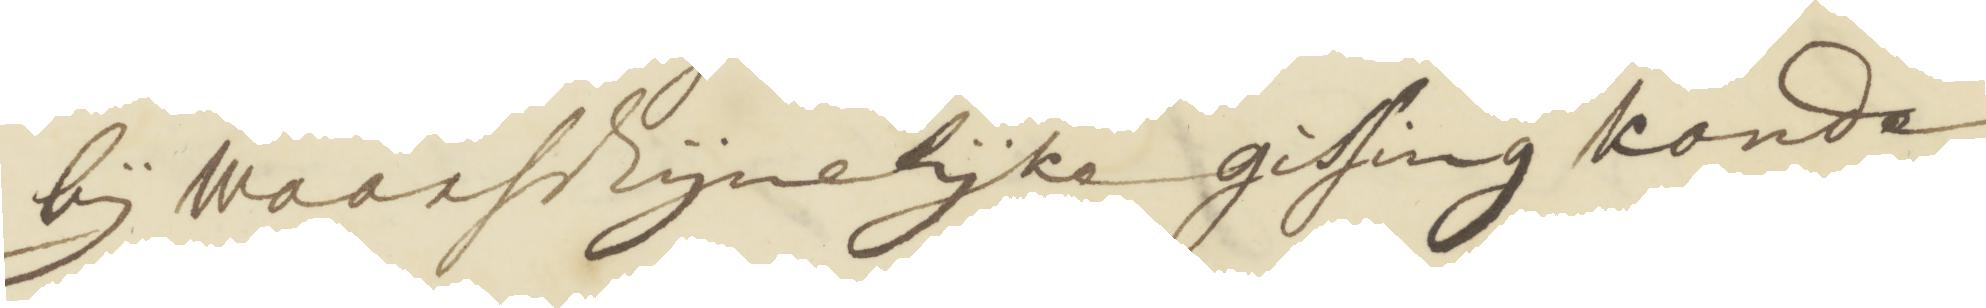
bij waarschijnelijke gissing konde
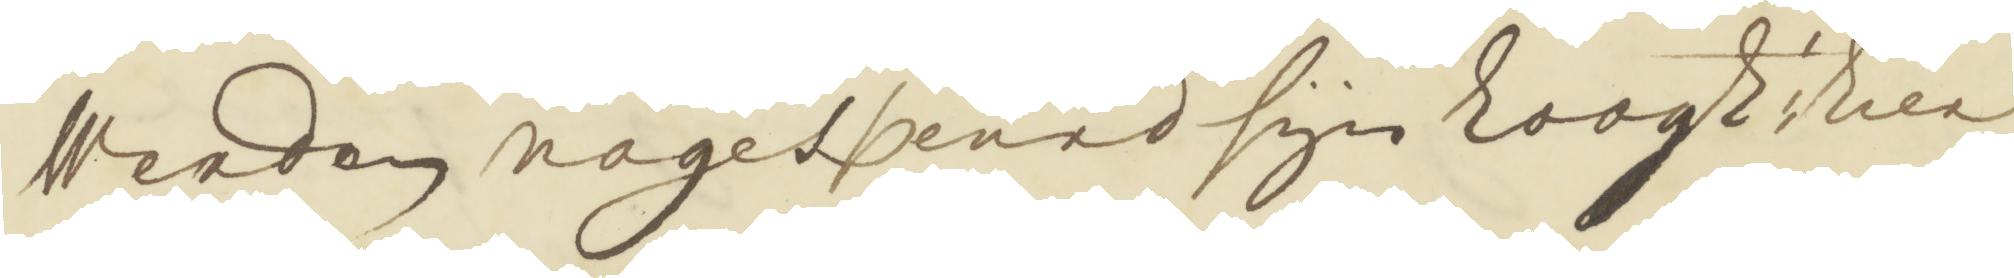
werden nagespeurd sijn hoogh„t hier
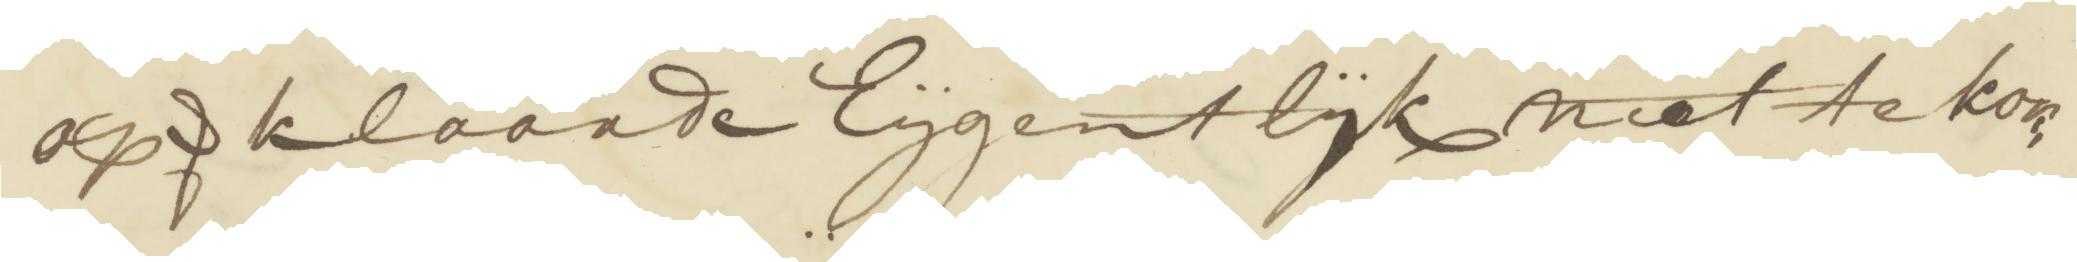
op verklaarde Eijgentlijk niet te kon„
